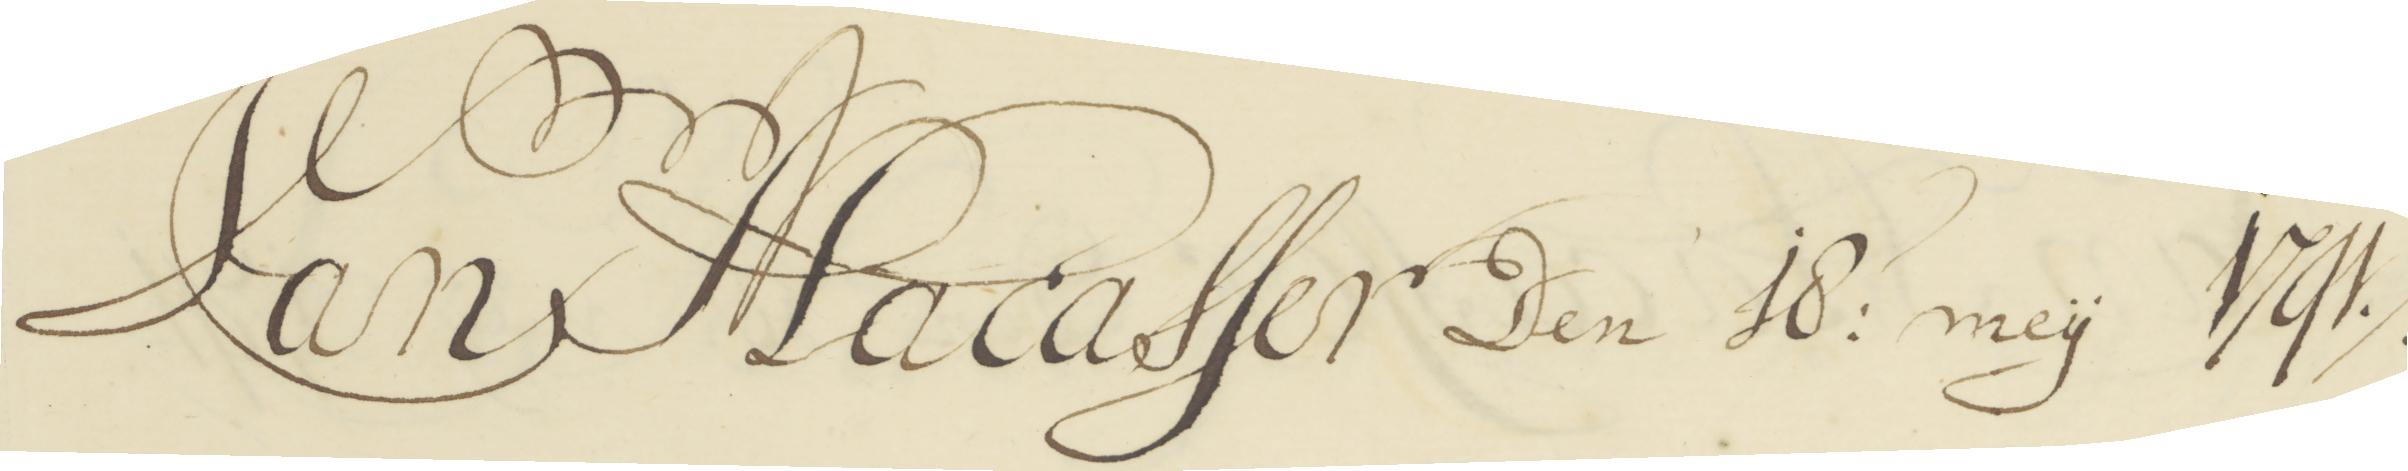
Van Macasser Den 18:' meij 1741./.
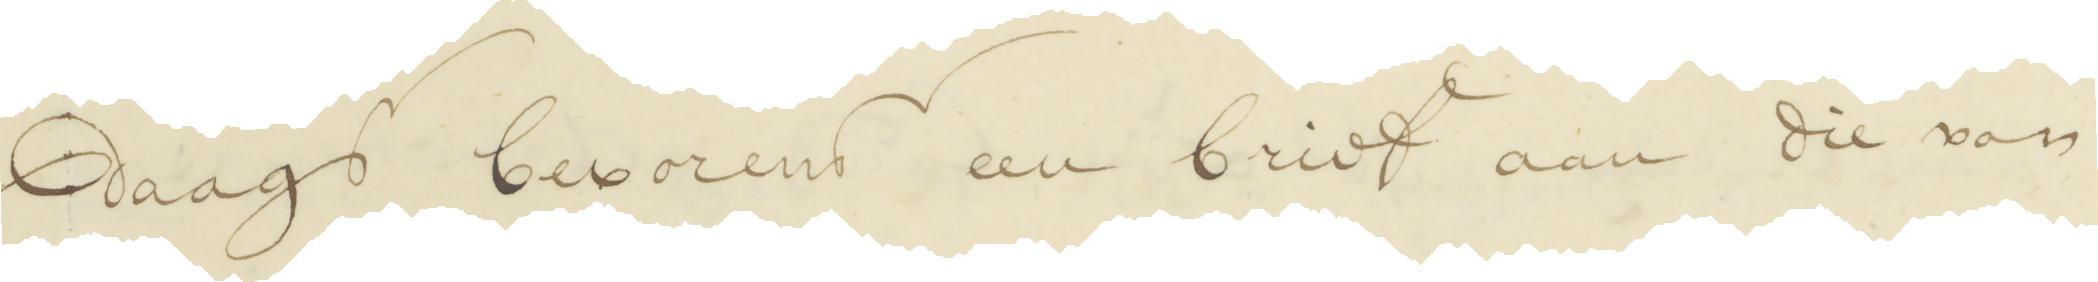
daags bevorens een brief aan die van
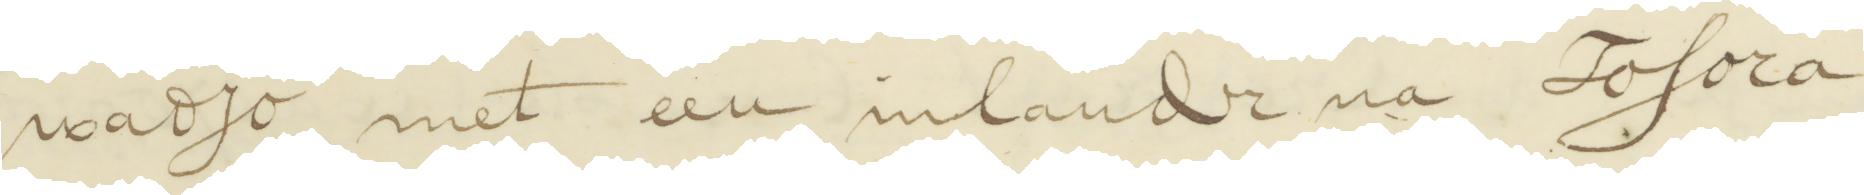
wadjo met een inlander na Tosora
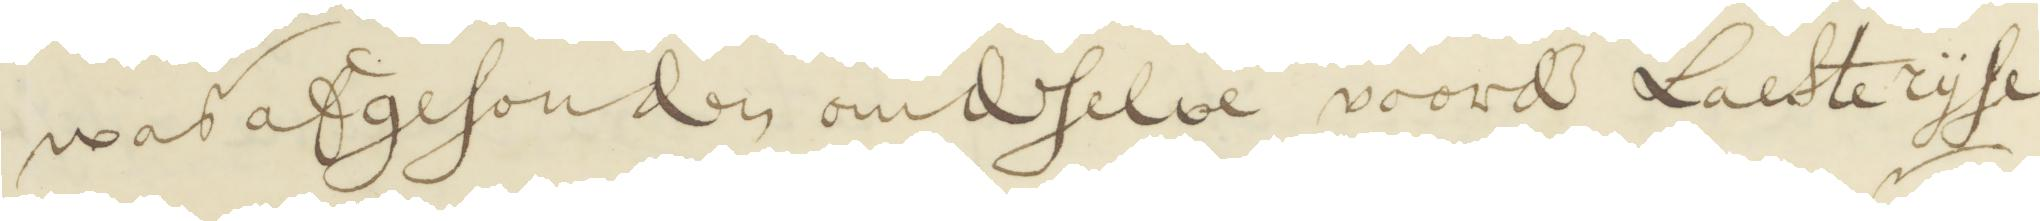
was afgesonden om deselve voorde Laeste rijse
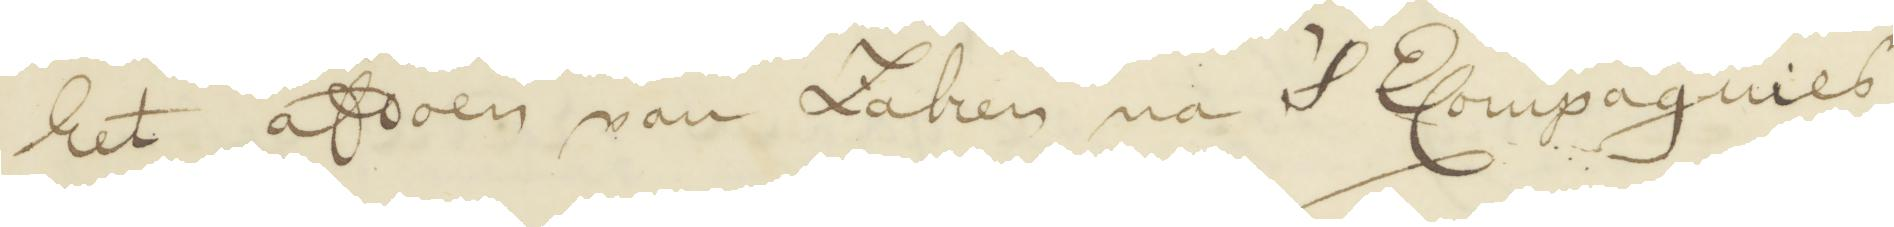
het afdoen van zaken na ’s ECompagnies
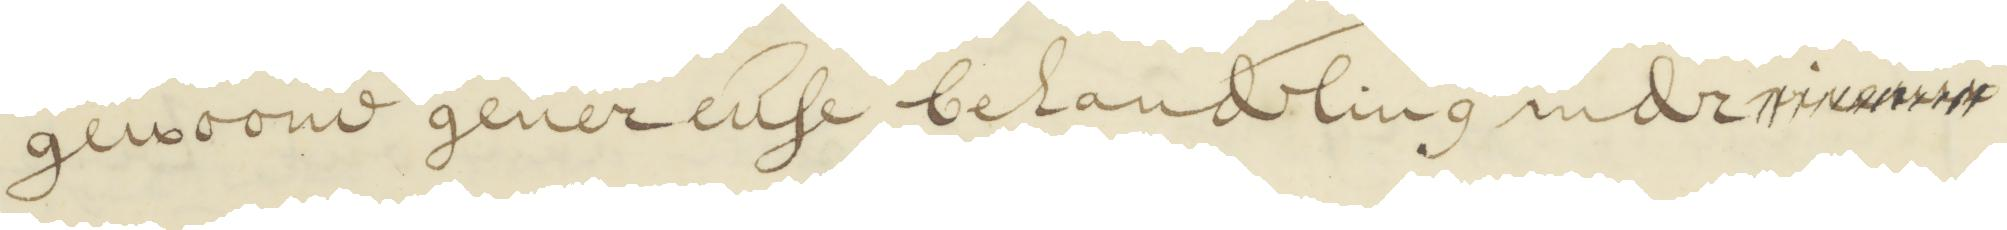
gewoone genereuse behandeling in der ninue
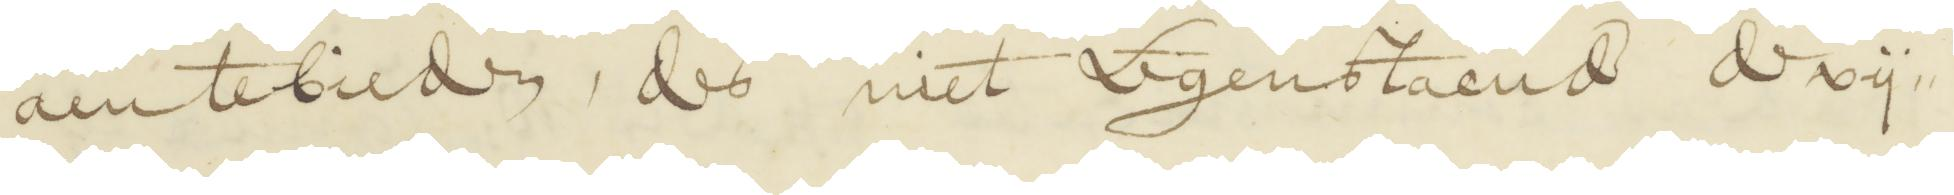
aen tebieden, des niet tegenstaende de vij„
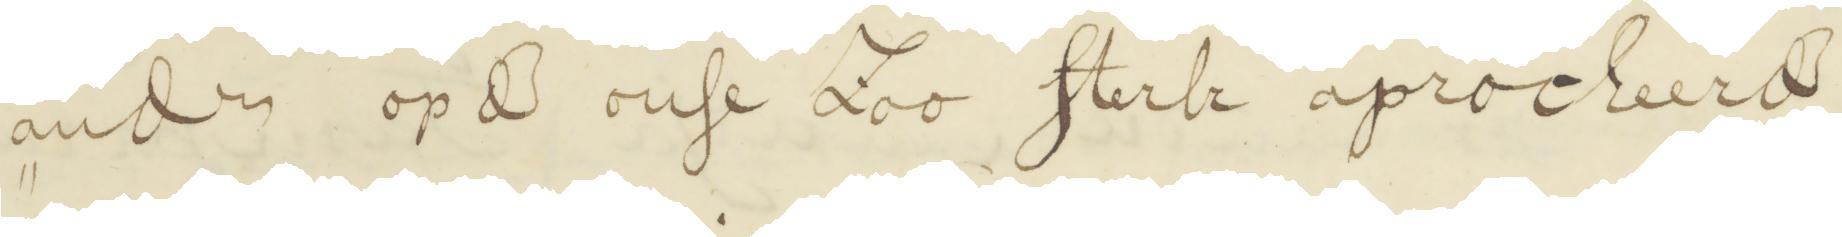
anden op de onse zoo sterk aprocheerde
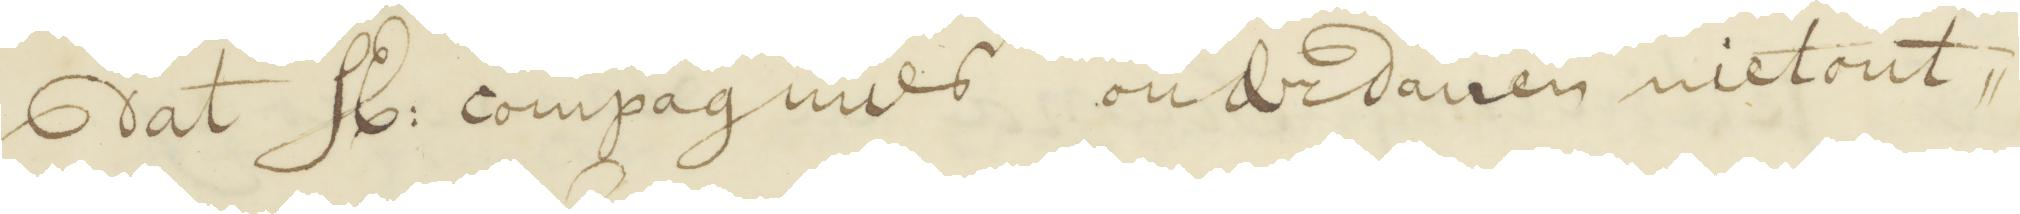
dat 'sE: compagnies onderdanen met ont„
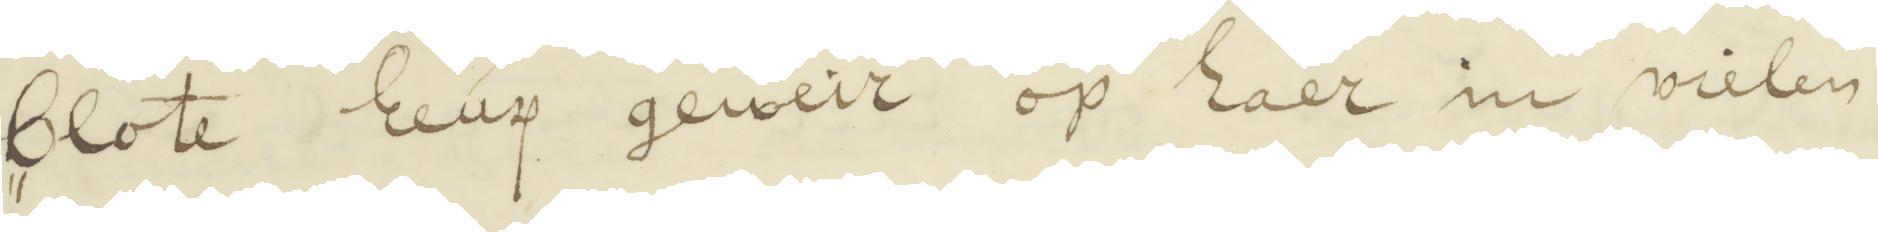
„blote heup geweir op haer in vielen
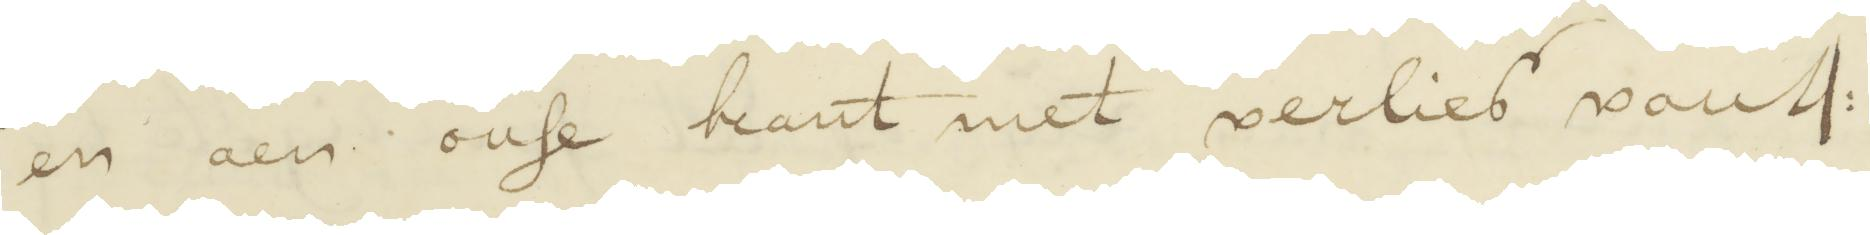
en aen onse kant met verlies van 4:
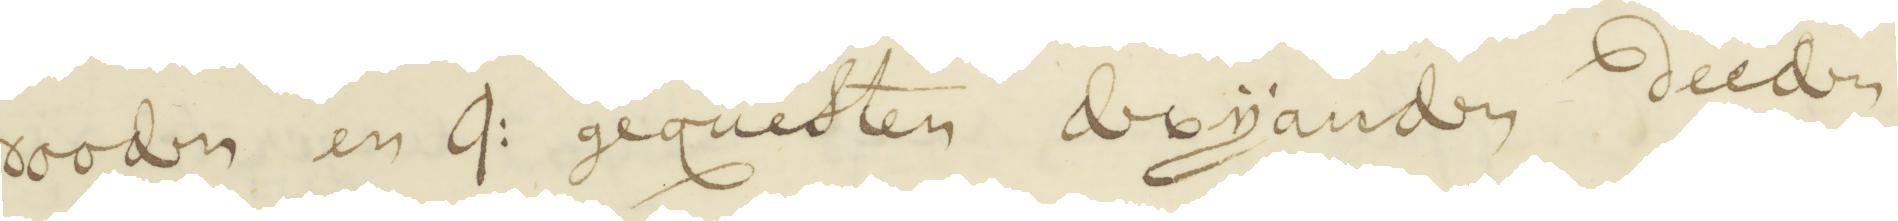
dooden en 4: gequesten de vijanden deeden
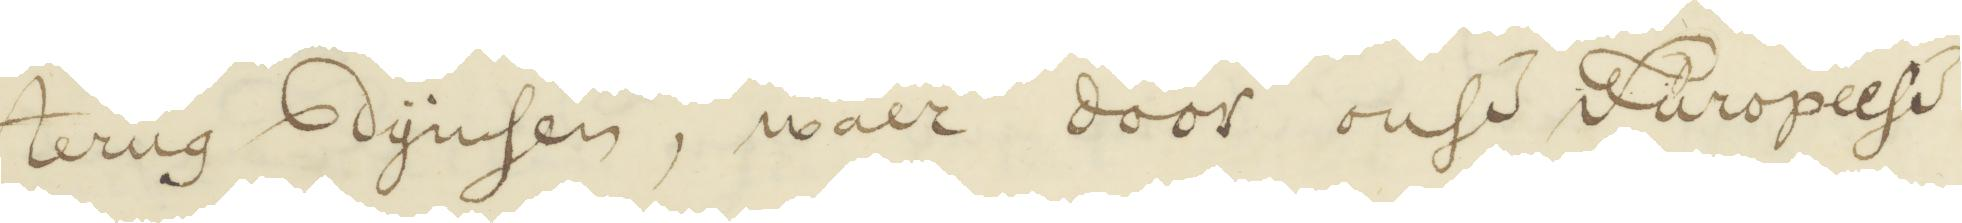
terug dijnsen, waer door onse Europeese
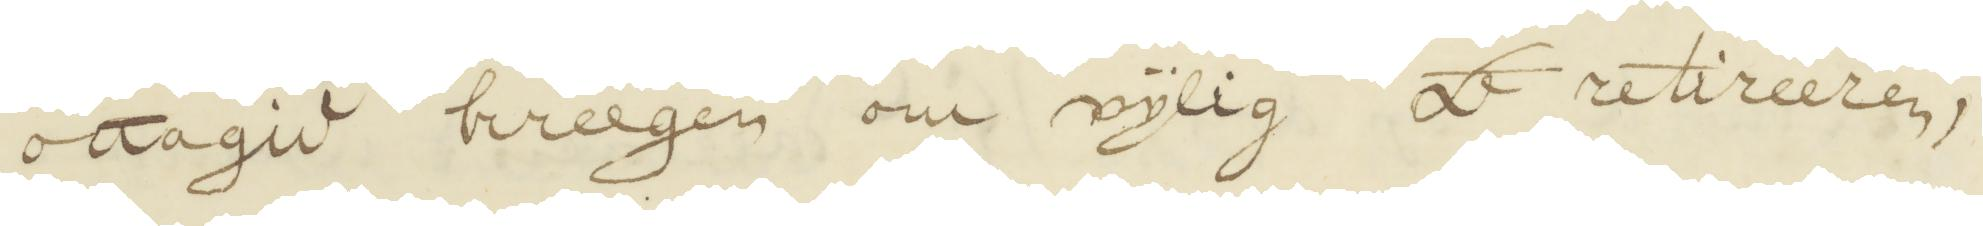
occagie kreegen om vijlig te retireeren,
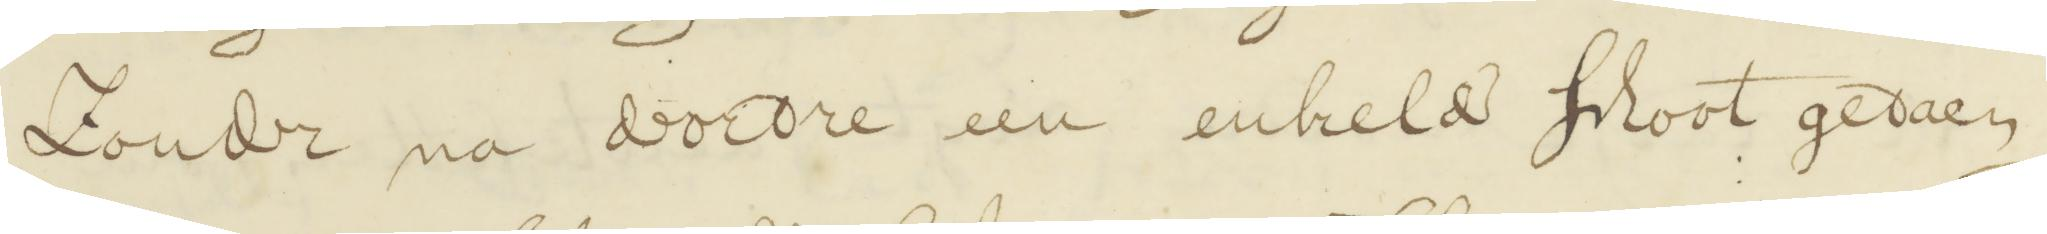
zonder na deordre een enkelde schoot gedaen
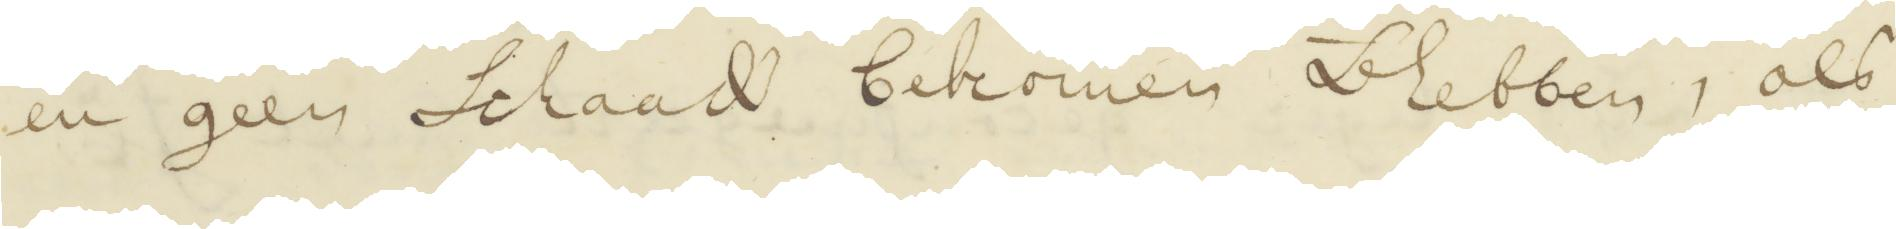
en geen schaade bekomen te hebben, als
